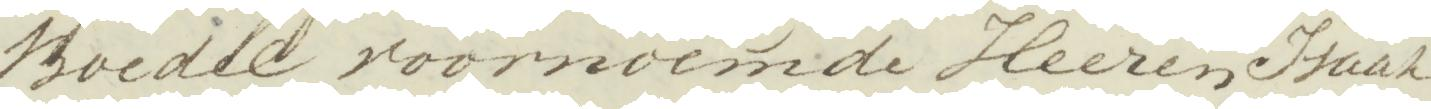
Boedel voornoemde Heeren Isaak
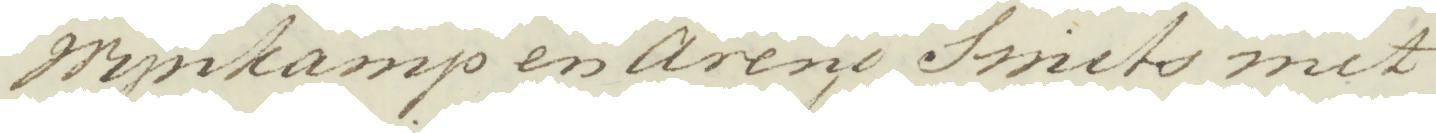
Wynkamp en Arend Smits met
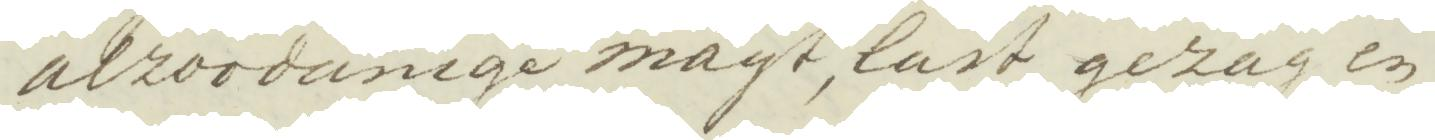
alzoodanige magt, last gezag en
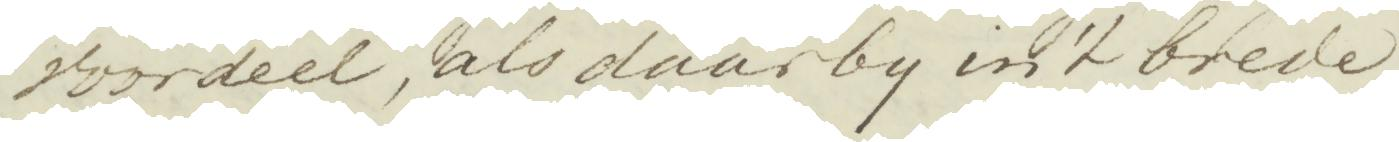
voordeel, als daar by in ’t brede
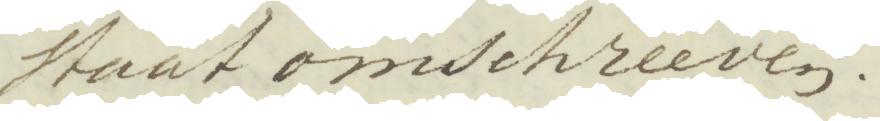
staat omschreeven.
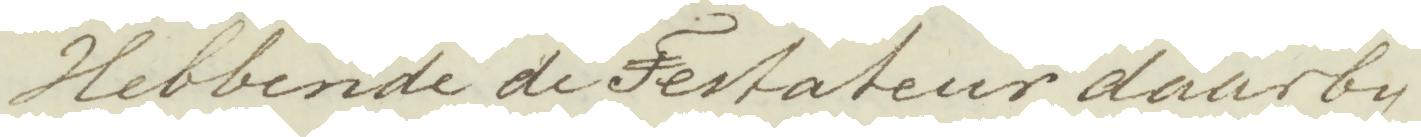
Hebbende de Testateur daarby
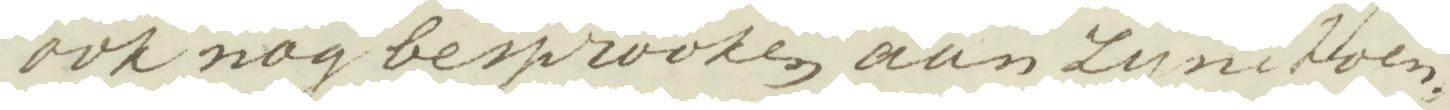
ook nog besprooken aan Zijne toen„
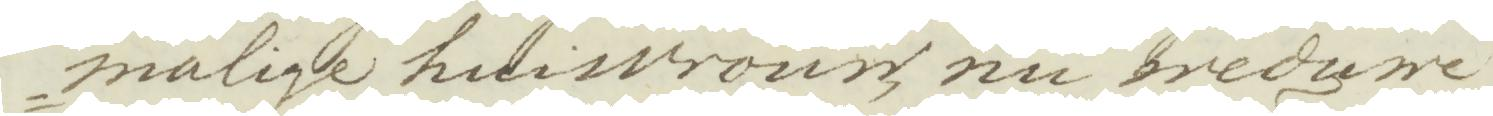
=malige huisvrouw, nu weduwe
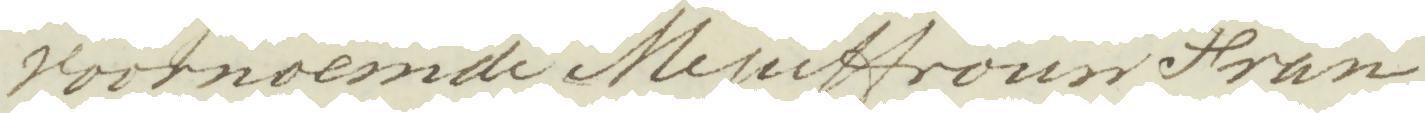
voornoemde Mejuffrouw Fran
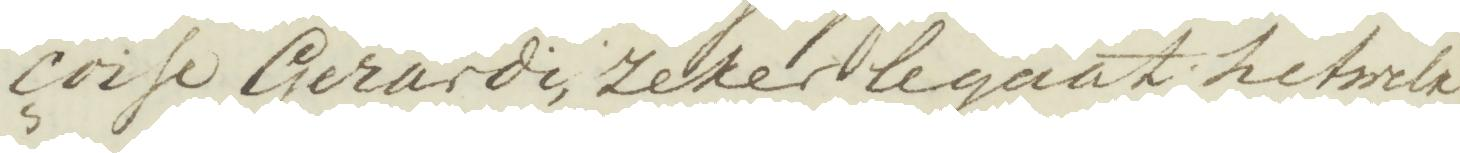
çoise Gerardi, zeker legaat hetwelk
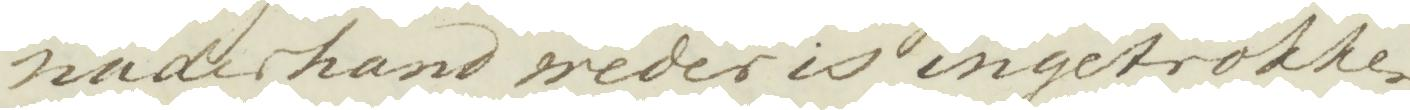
naderhand weder is ingetrokken
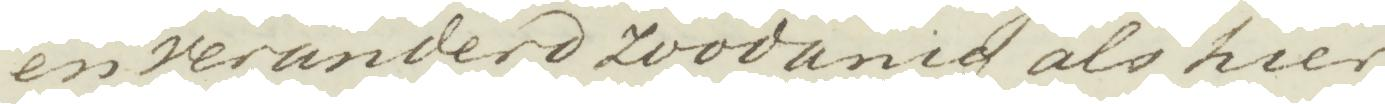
en veranderd zoodanig als hier
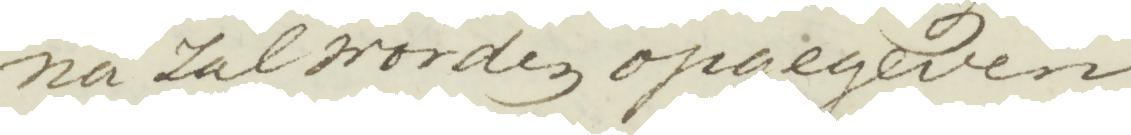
na zal worden opgegeven
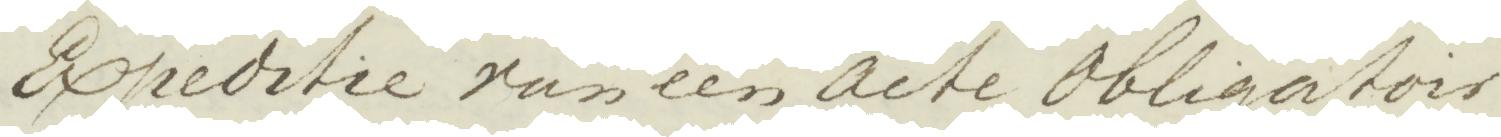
Expeditie van een Acte Obligatoir
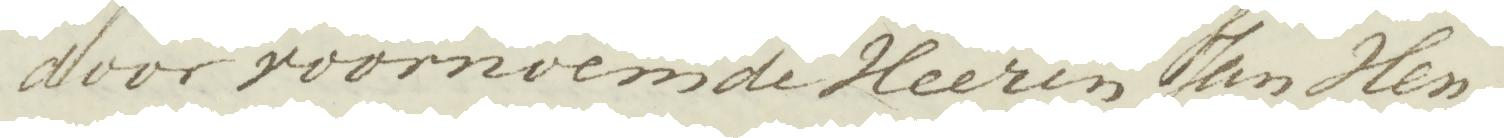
door voornoemde Heeren Jan Hen
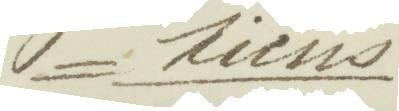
=ricus
